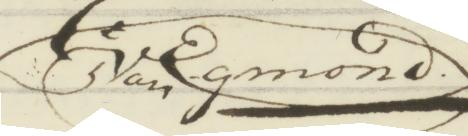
t Van Egmond
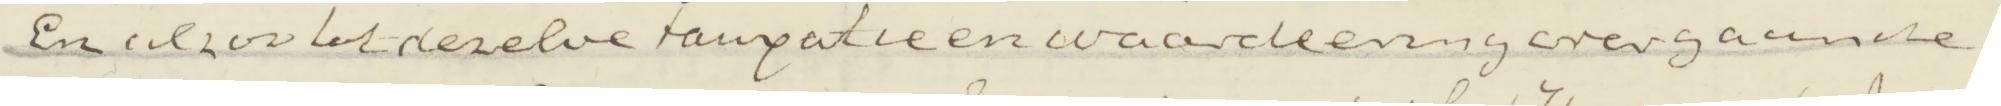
En alzoo tot dezelve tauxatie en waardeering overgaande
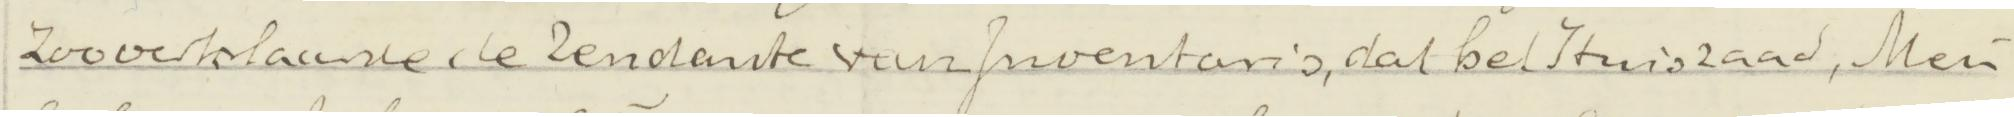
zoo verklaarde de rendante van Jnventaris, dat het Huisraad, Meu
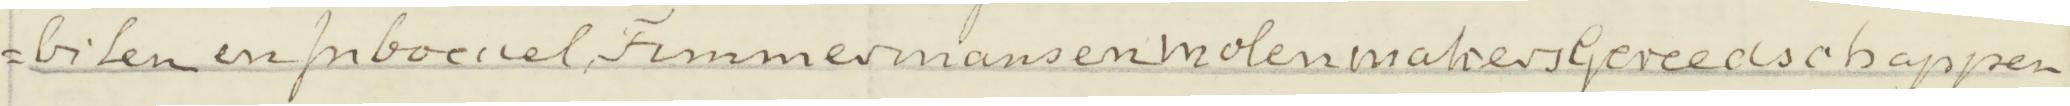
=bilen en Jnboedel, Timmermans en molenmakers Gereedschappen
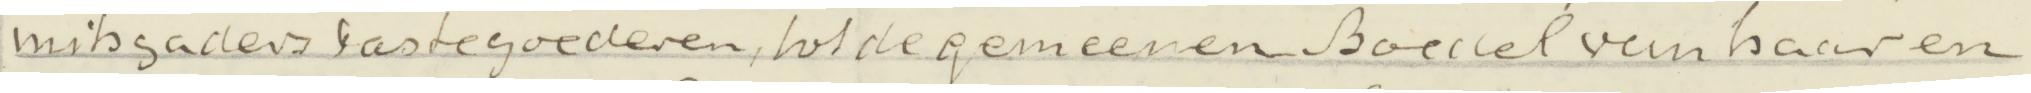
mitsgaders vaste goederen, tot de gemeenen Boedel van haar en
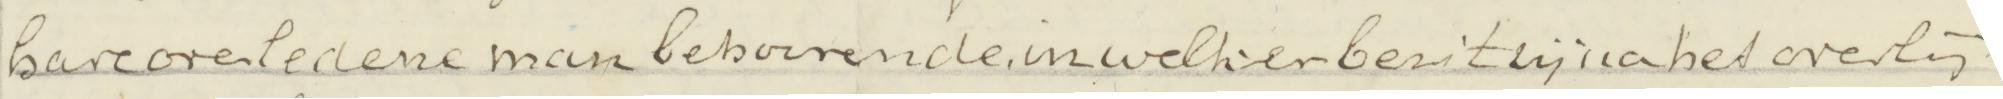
hare overledene man behoorende, in welker bezit zij na het overlij
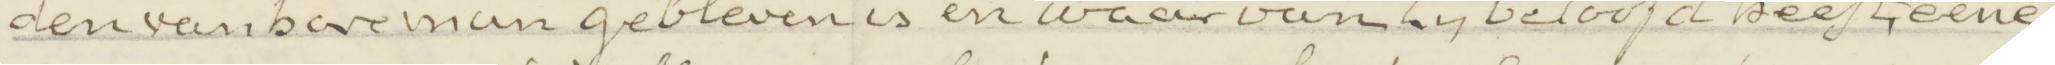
den van hare man gebleven is en waarvan zij beloofd heeft, eene
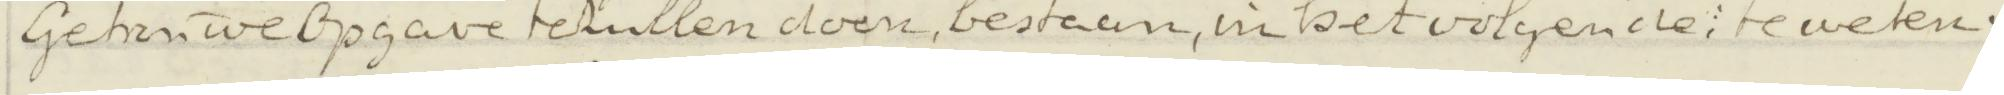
Getrouwe Opgave te zullen doen, bestaan, in het volgende: te weten
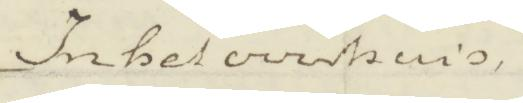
In het voorhuis,
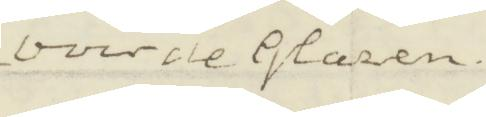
voor de Glazen
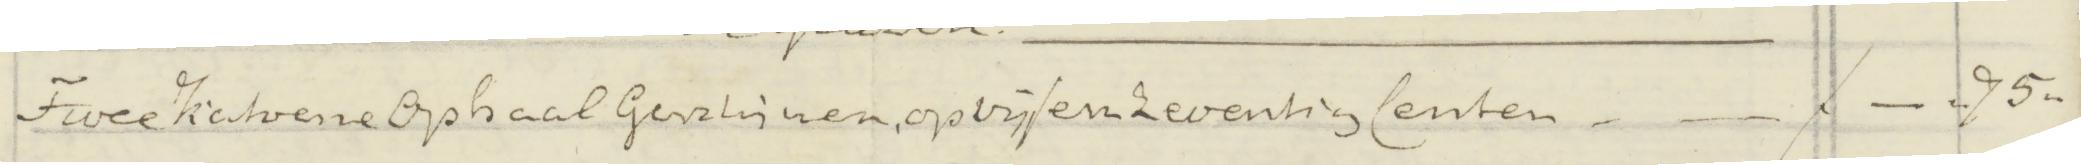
Twee Katoene Ophaal Gordijnen, op vijf en zeventig Centen - - - ƒ —„75„
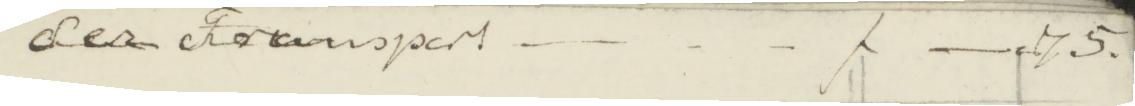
Per Transport - - - - „ ƒ —„75
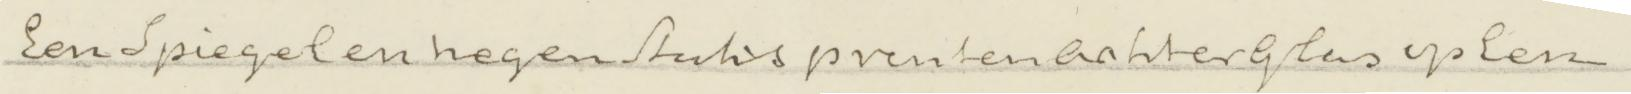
Een Spiegel en negen stuks prenten achter Glas op Een
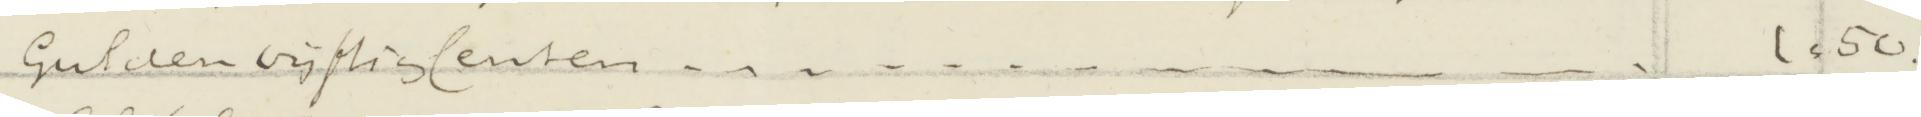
Gulden vijftig Centen - - - - - - - - - - - - - „ 1„50
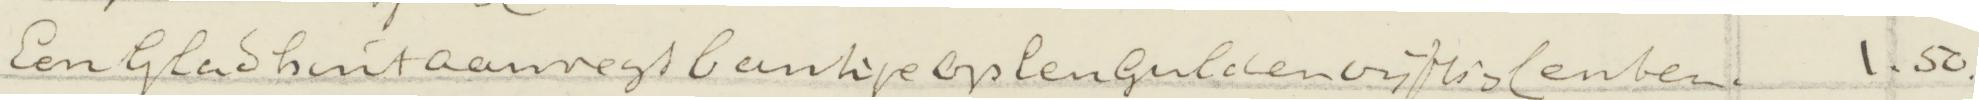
Een Gladhout aanregt bankje op Een Gulden vijftig Centen „ 1„50
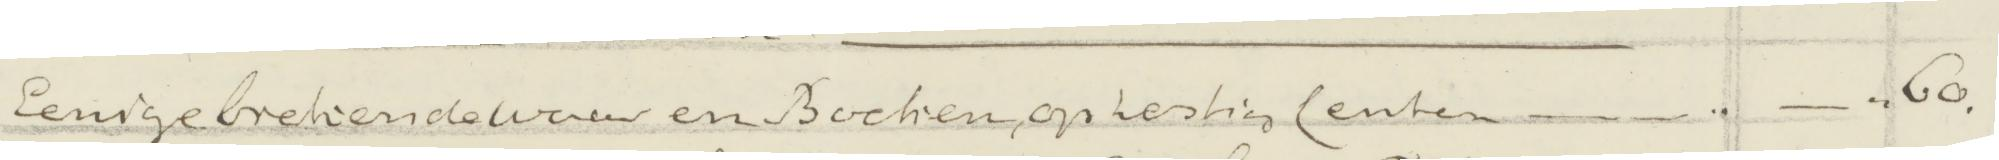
Eenige brekende waar en Boeken, op zestig Centen - - - „ — „60.
